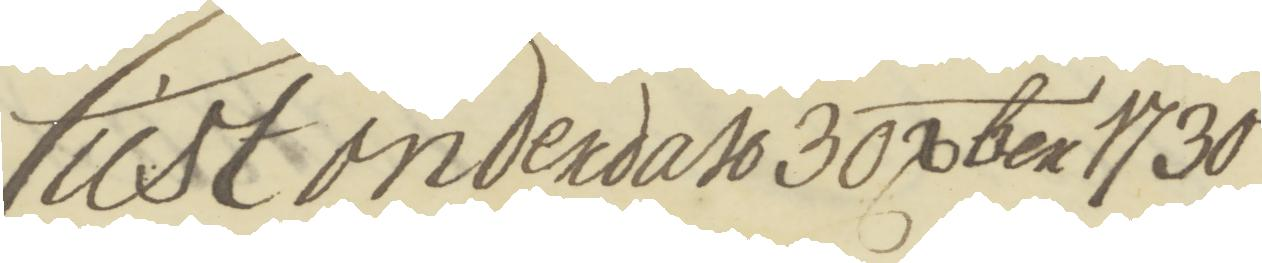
Cust onderdato 30 xber 1730
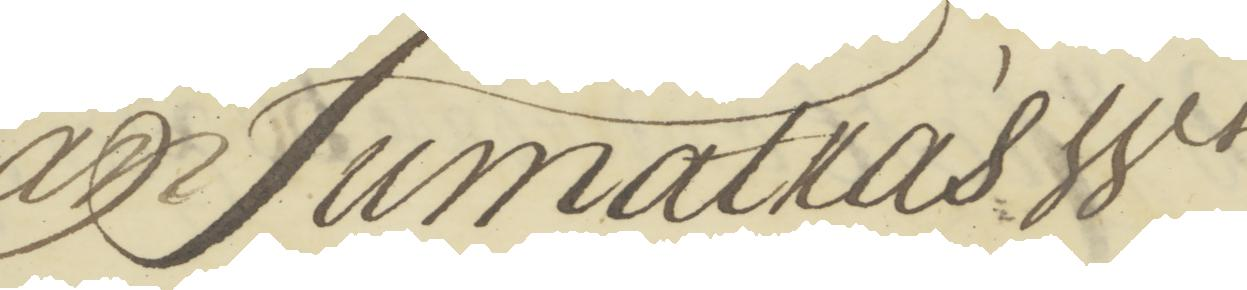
Van Sumatra's Wt
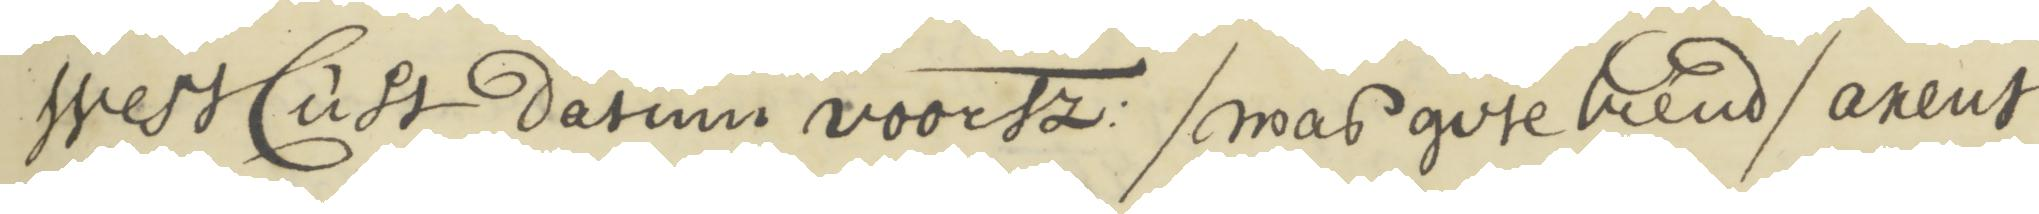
west Cust datum voorsz: /was getekend/ arent
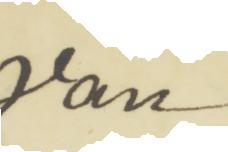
I:' van
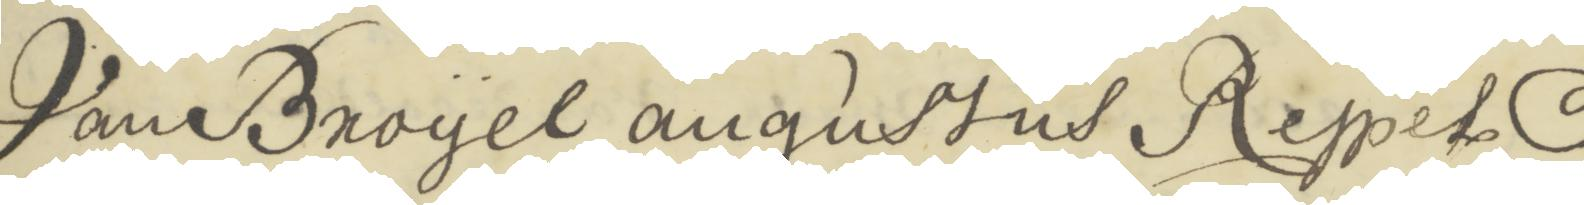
Van Broijel, augustus Reppel
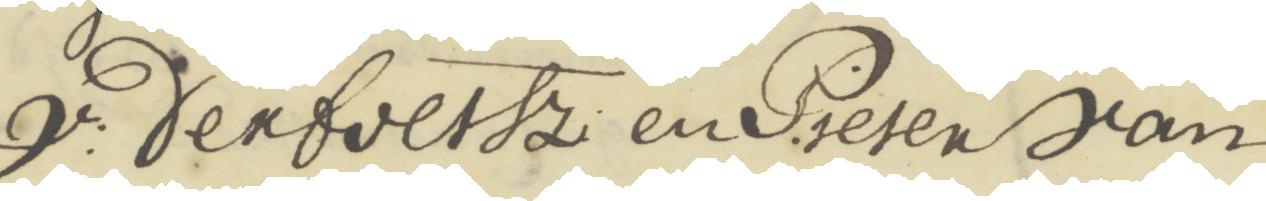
V. der feltsz: en Pieter van
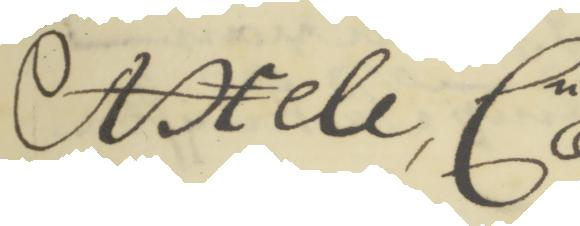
Axele, Cn W:m
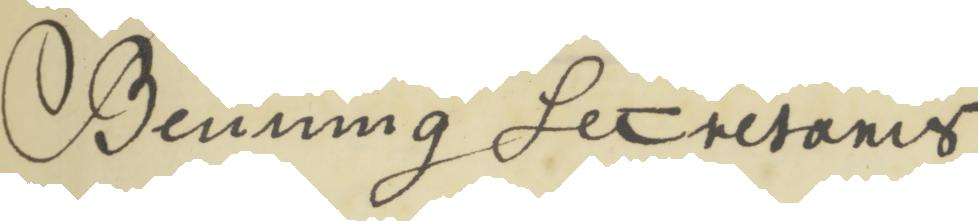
Beuning secretaris
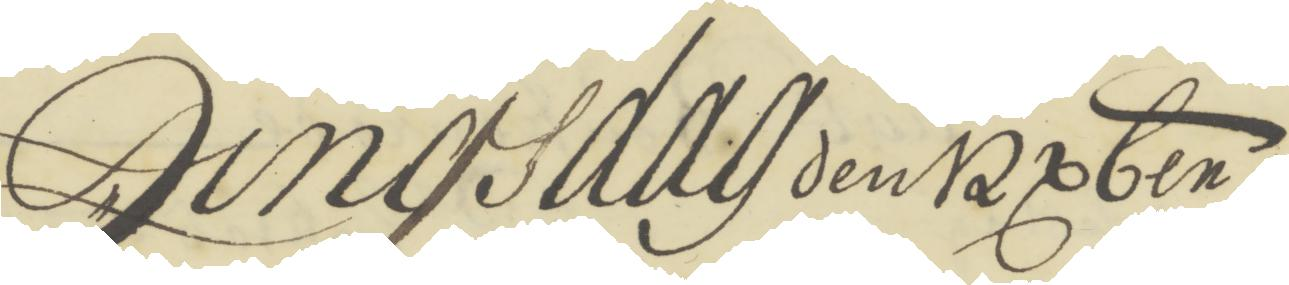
Dingsdag den 12 Xber:
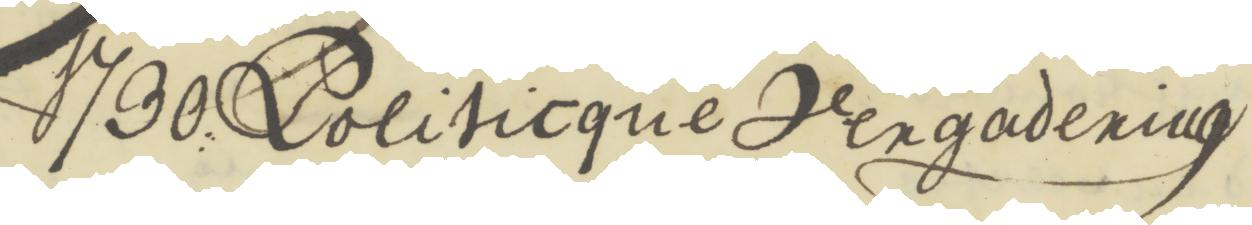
1730: Politicque Vergadering
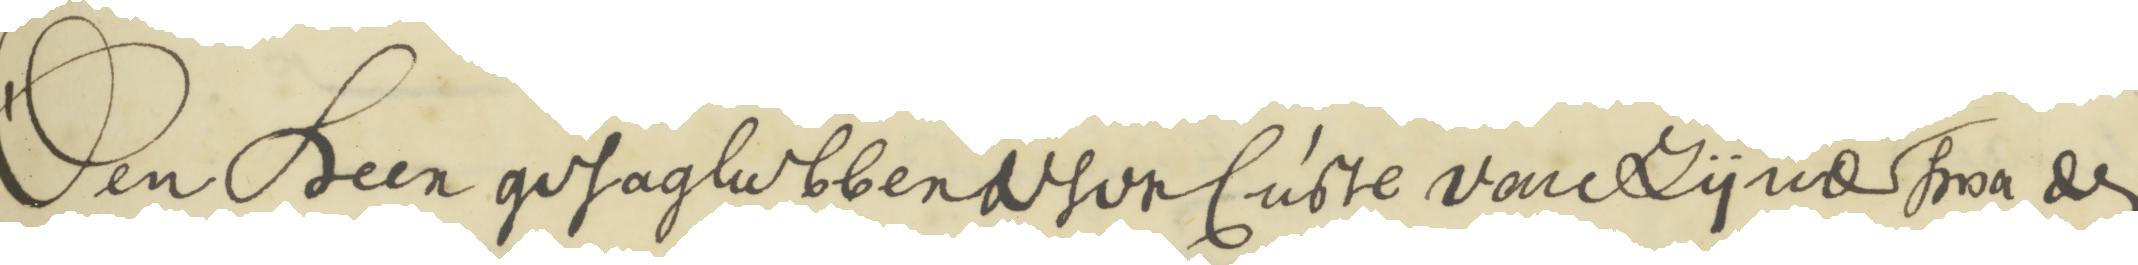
Den Heer gesaghebber deser Custe van Zijnde swa„ den
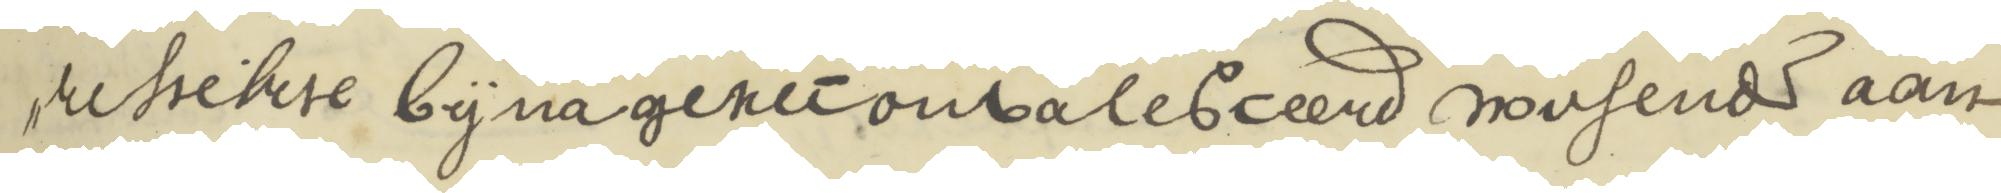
re siekte bijna gereconvalesceerd wesende aan
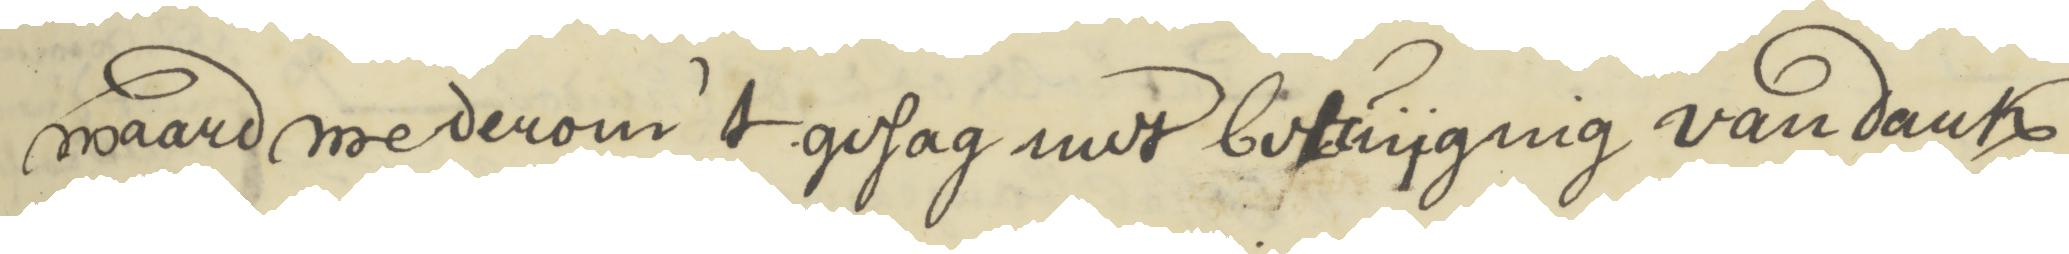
waard wederom 't gesag met betuijging van dank
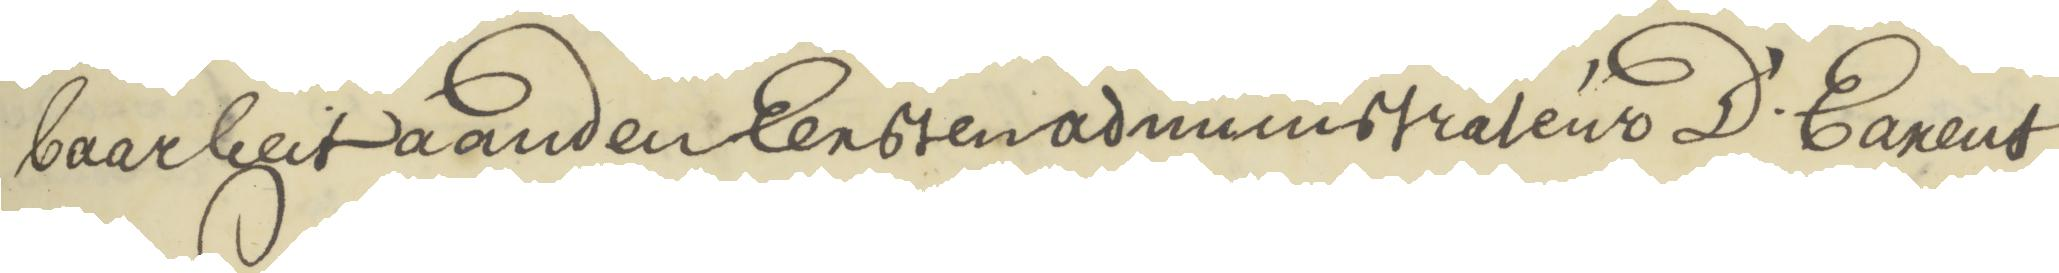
baarheit aanden Eersten adminstrateur D'. E arent
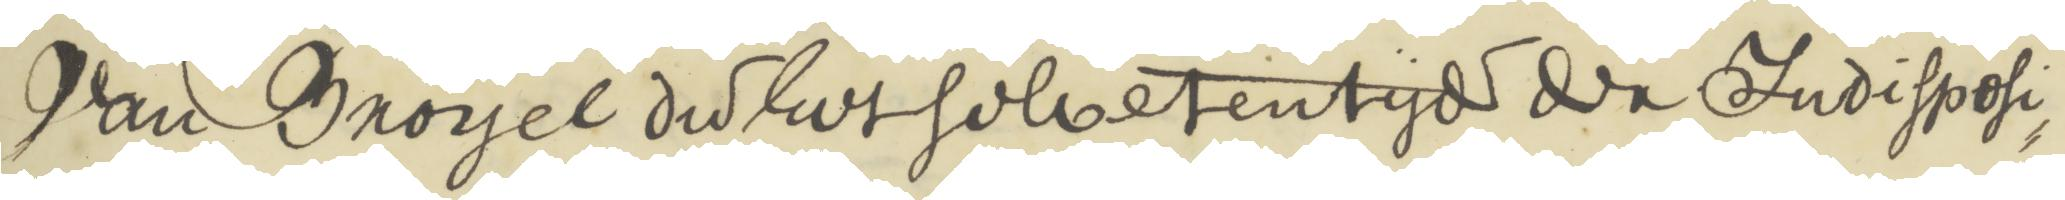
Van Broijel die het selve tentijde der Indisposi„
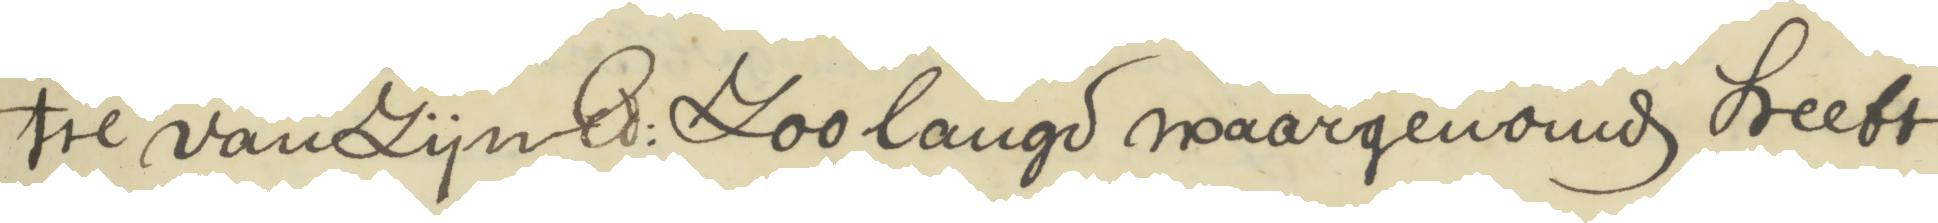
tie van zijn Ed: zoo lange waargenomen heeft
